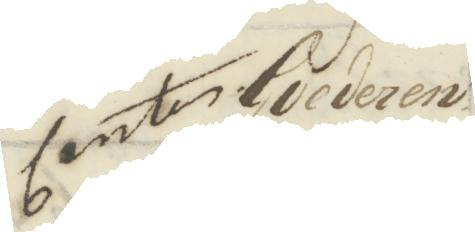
Cent Goederen
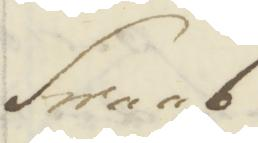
Swaab
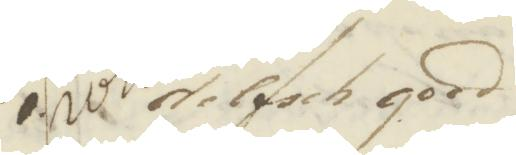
delfsch goed
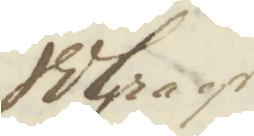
Vd Gragt
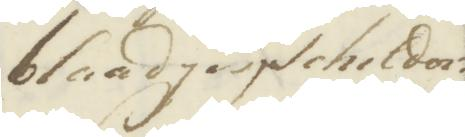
blaadjes geschilder
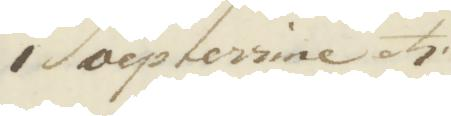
1 Soepterrine h.
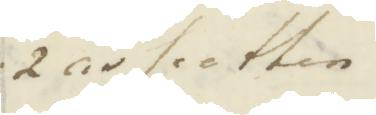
2 asscatten
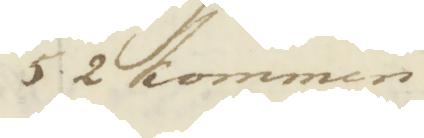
5: 2 kommen
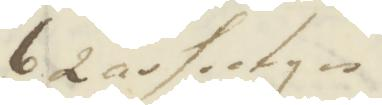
6. assaakjes
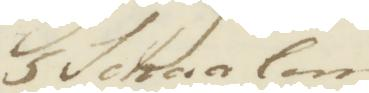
5 schaalen
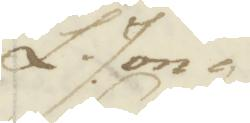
L Jong
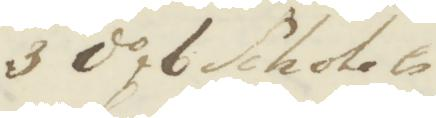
3 d„o 6 Schotel
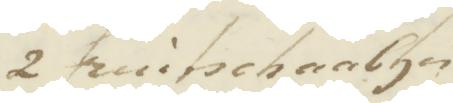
2 fruitschaaltjes
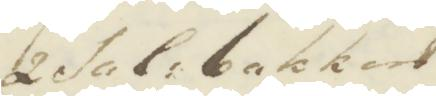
2 sal: bakkers
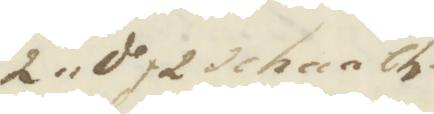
2„ d„o 2 schaaltjes
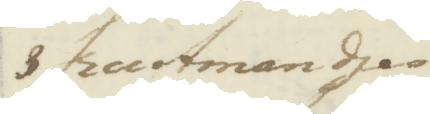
3 fruitmandjes
